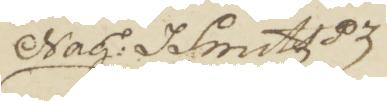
Nage: I Smnith 93
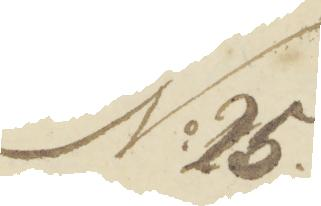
No 25.
